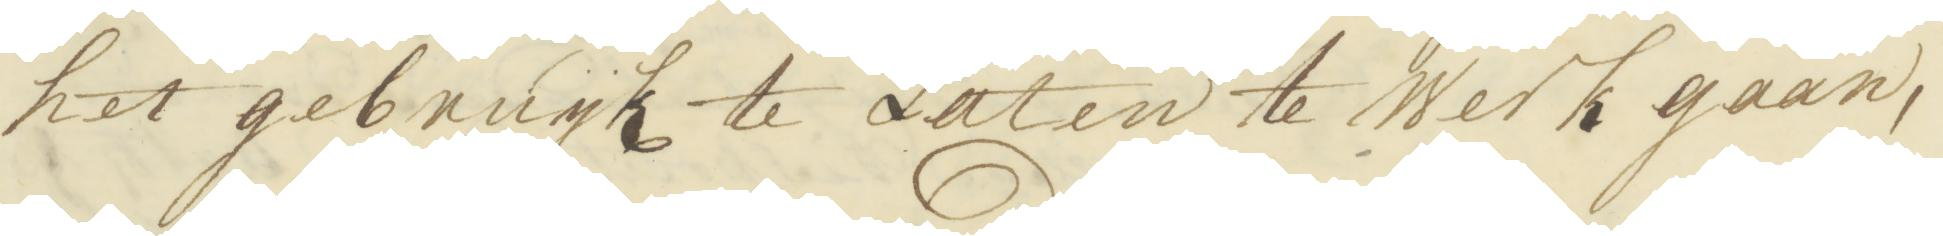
het gebruijk te laten te werk gaan,
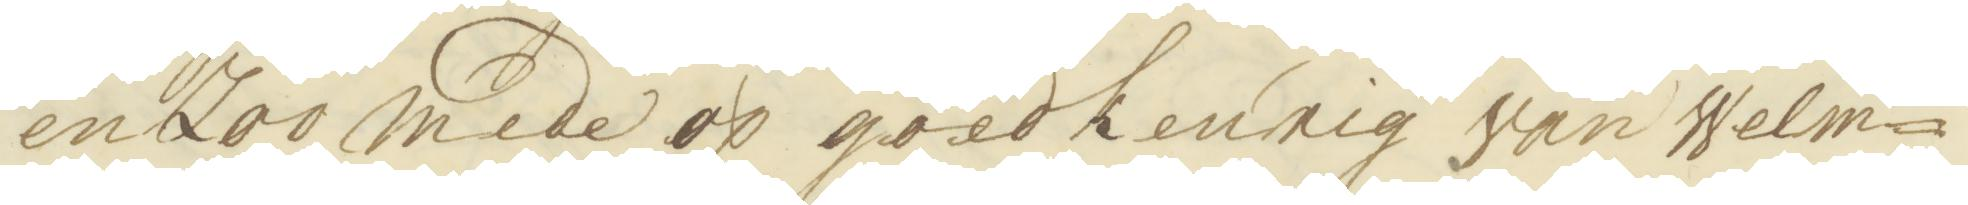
en zoo mede op goedkeurig van Welm=te
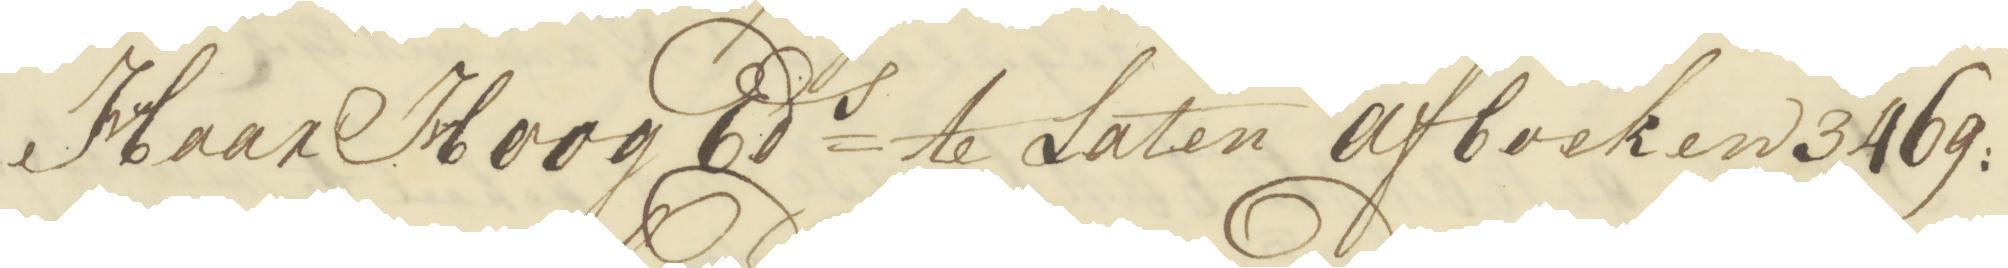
Haar Hoog Ed=s te Laten afboeken 3469:
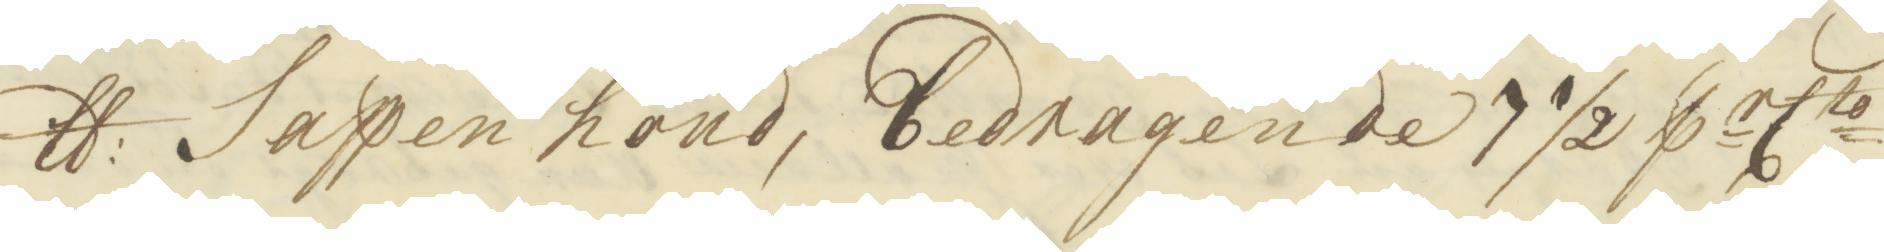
lb: Sappenhoud, bedragende 7½ p=r C=to
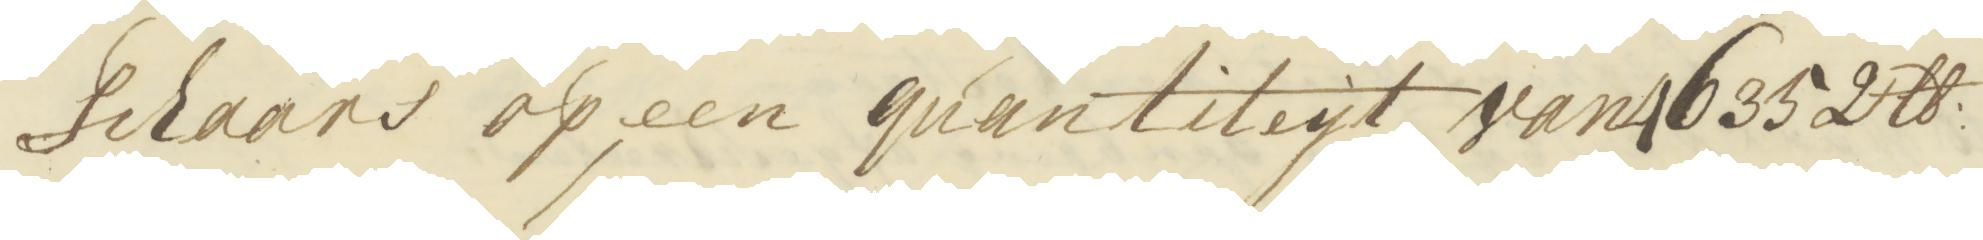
schaars op een quantiteijt van 46352 lb:
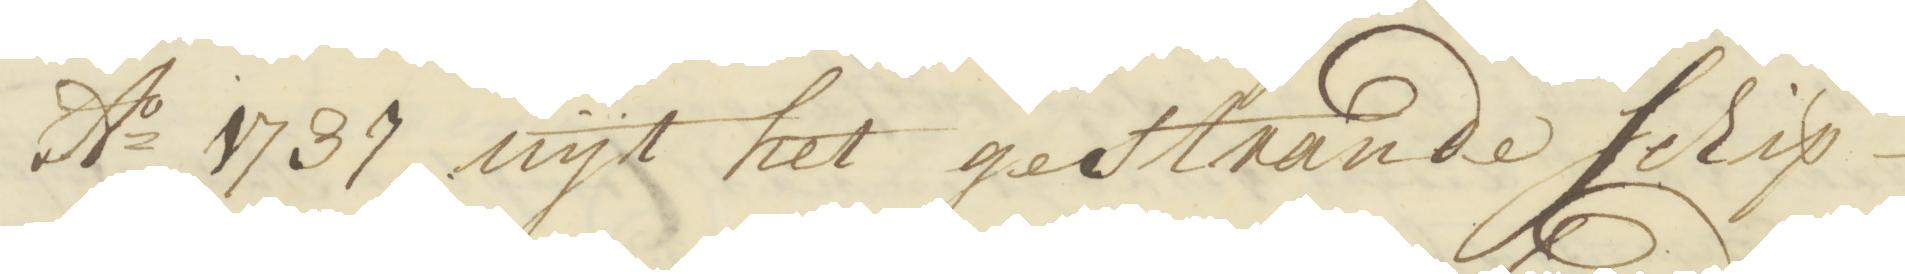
A=o 1737 uijt het gestrande schip
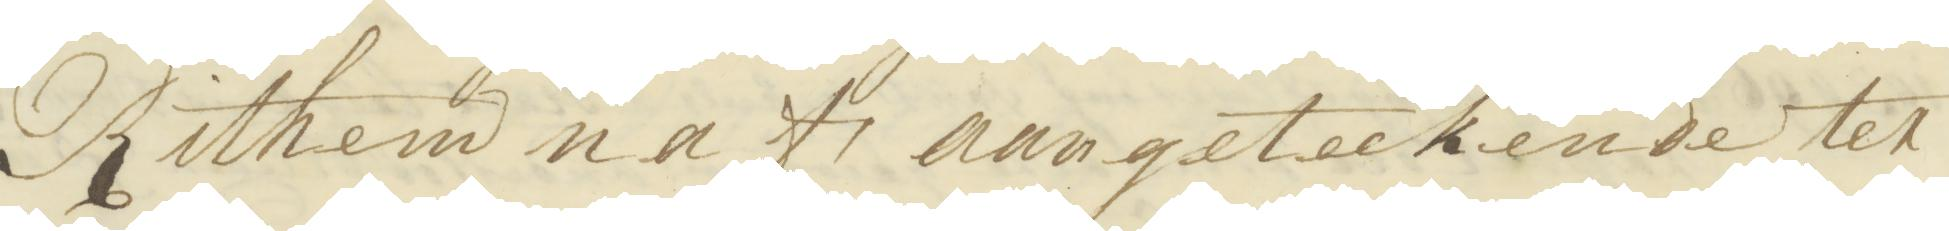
Rithem na t' aangeteekende ter
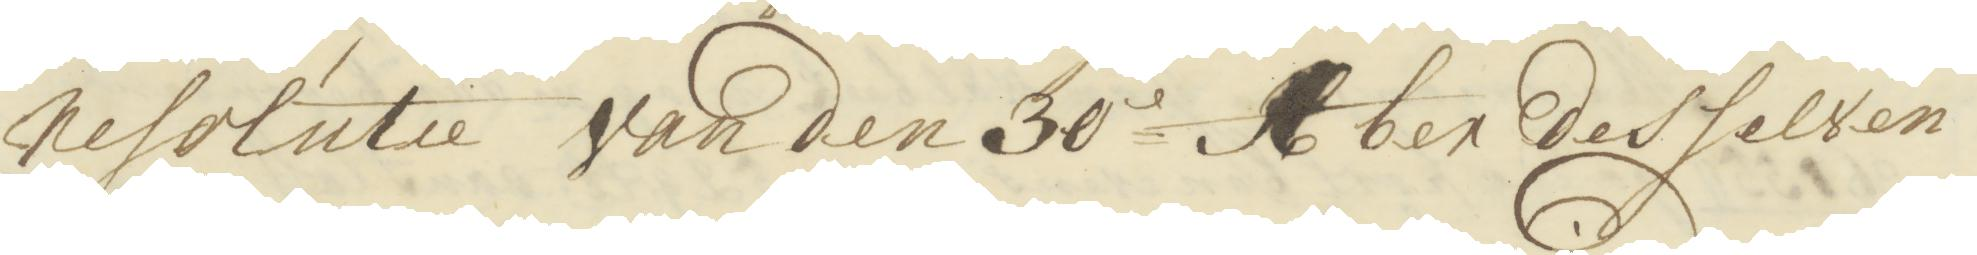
resolutie van den 30=' xber desselven
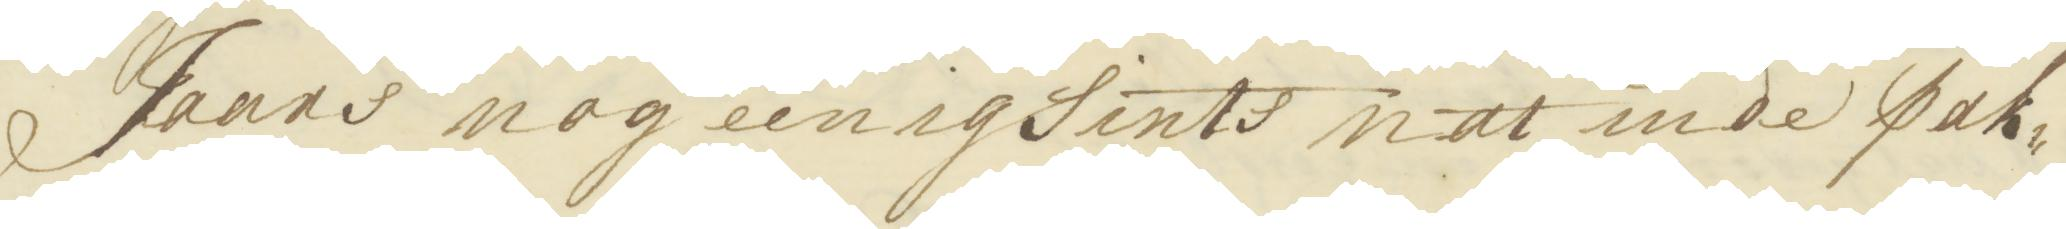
Jaars nog eenigsints nat inde pak„
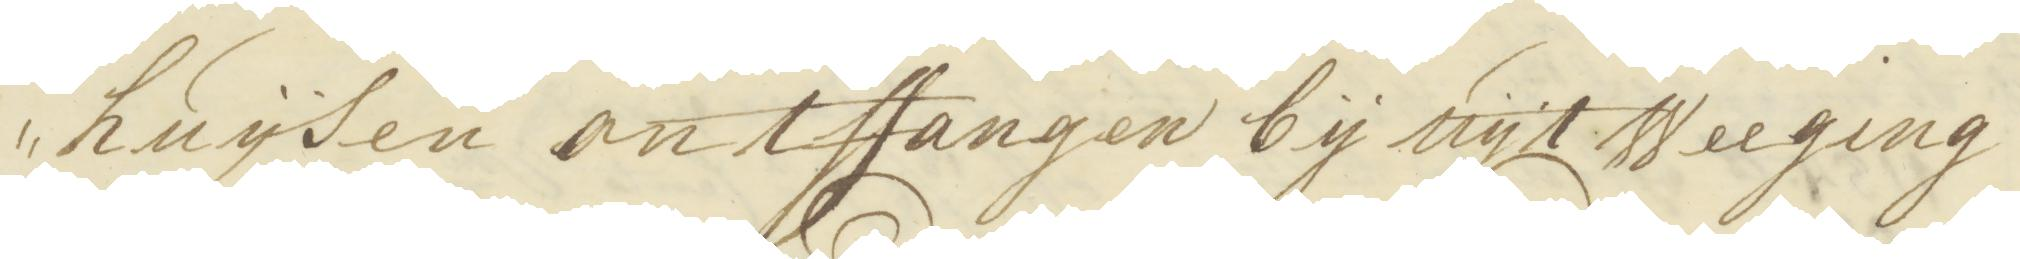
„huijsen ontffangen bij uijtweeging
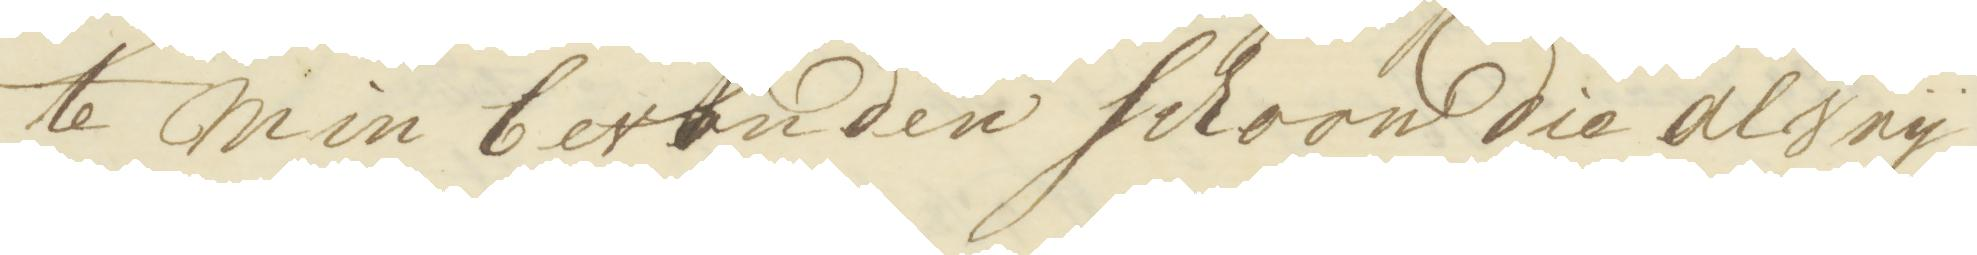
te min bevonden schoon die al vrij
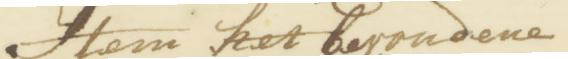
Item het bevondene
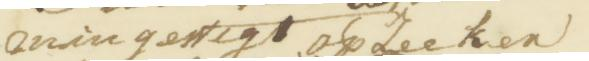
min gewigt op zeeker
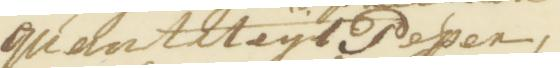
quantiteijt Peper,
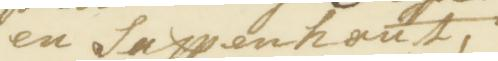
en Sappenhout,
